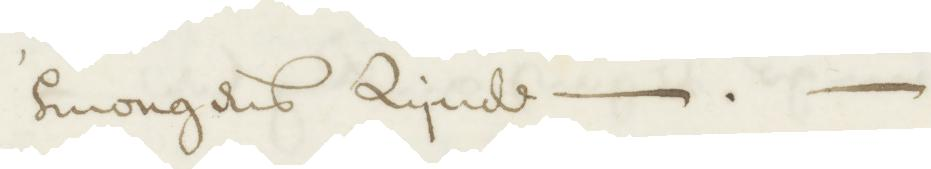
'smorgens zijnde —. —
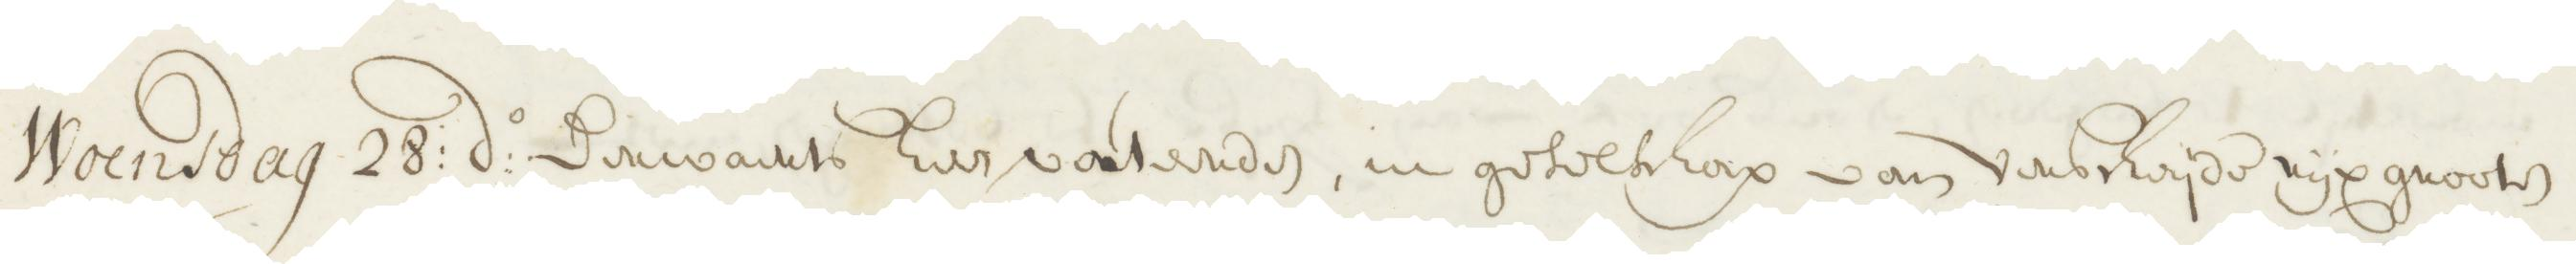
Woensdag 28: d:o Derwaerts heen voutenden, in geselschap van verscheijde rijx grooten
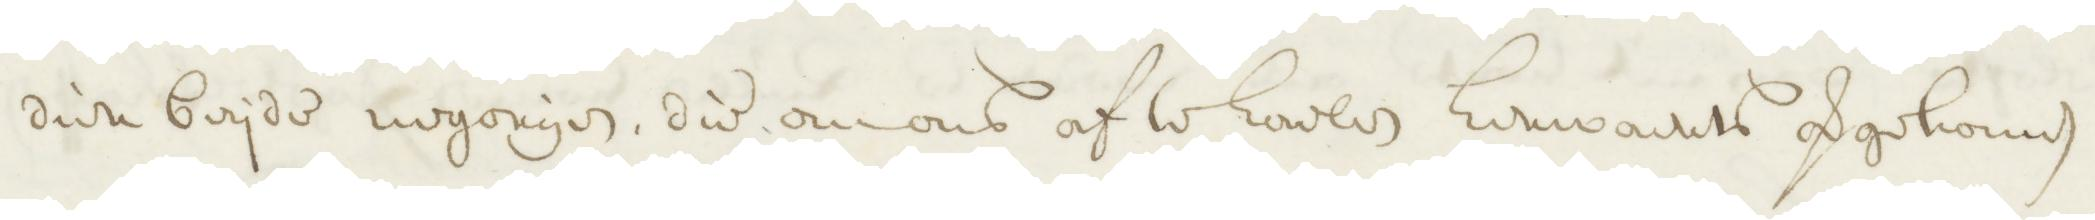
dier beijde negorijen, die om ons af te haelen herwaerts vergekomen
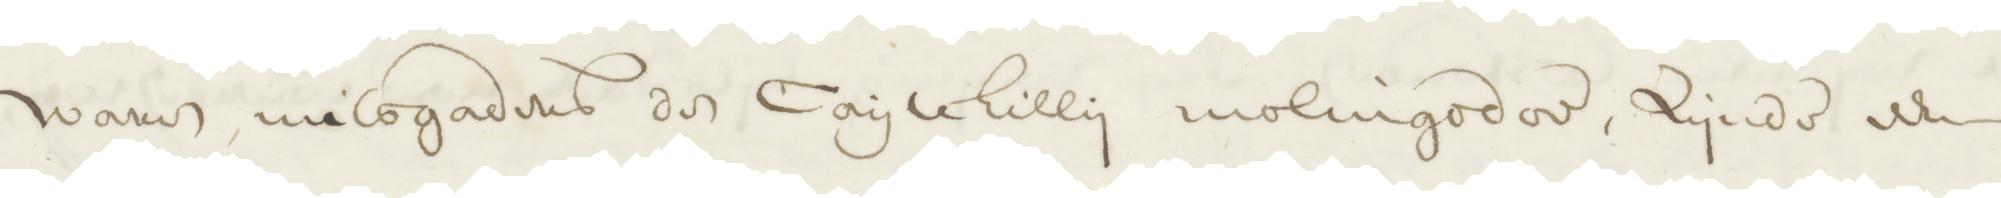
waren, mitsgaders den caijtchillij molingodoe, zijnde een
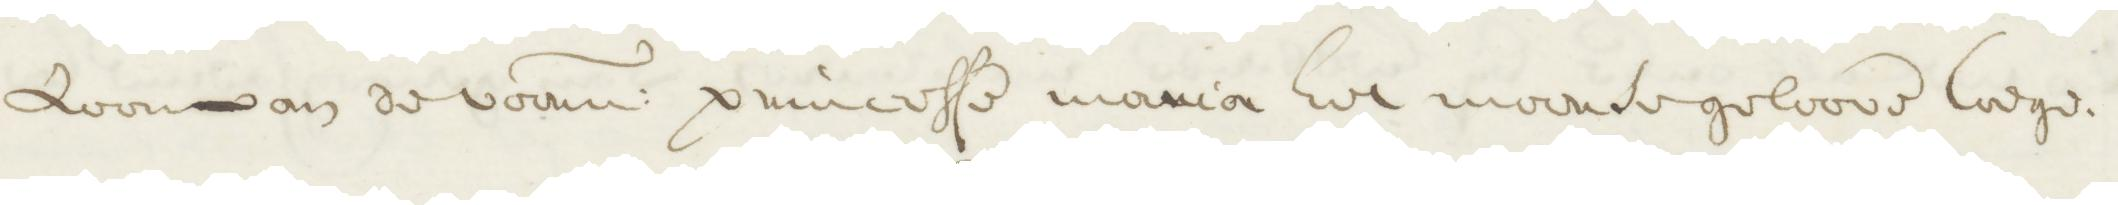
zoon van de voorm: princesse maria het moorse geloove toege.
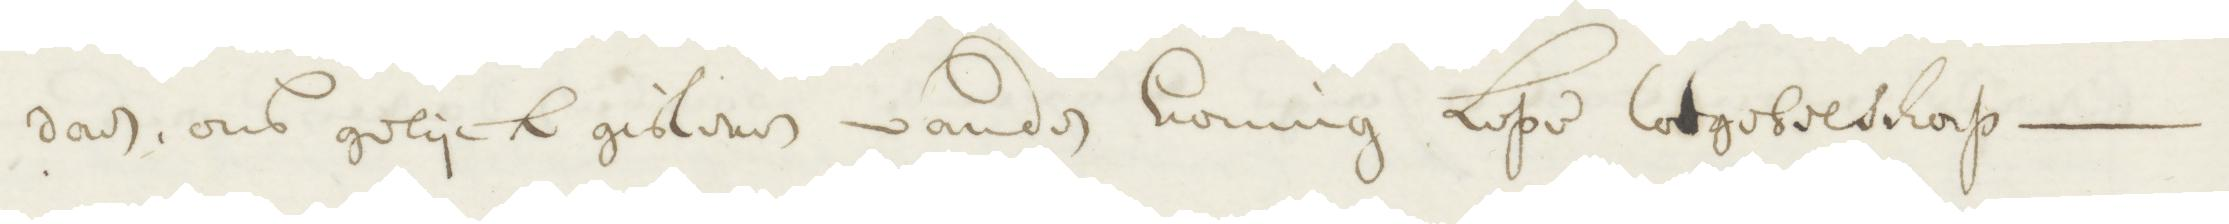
daen, ons gelijck gisteren vanden koning Lepe tot geselschap —
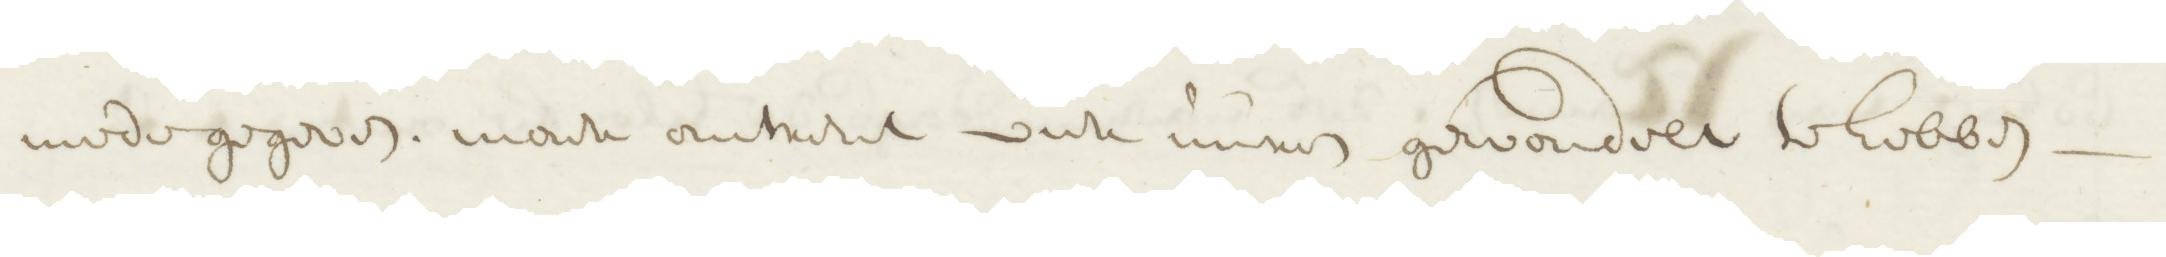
mede gegeven. maer omtrent vier uuren gewandelt te hebben —
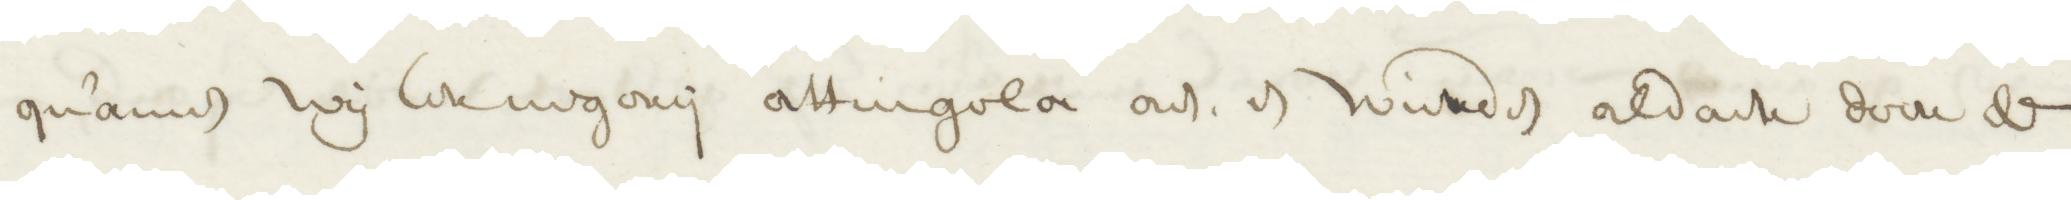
quamen wij ter negorij attingela aen. en wierden aldaer door de
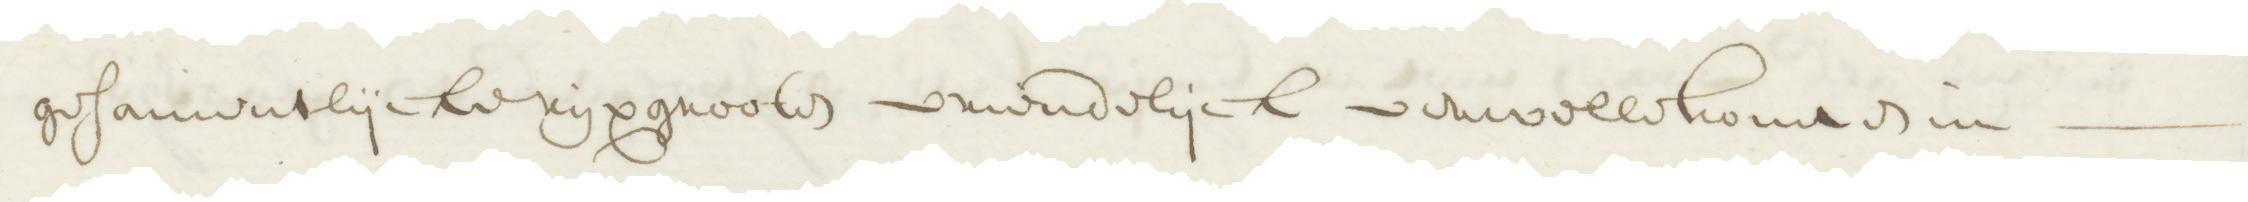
gesamentlijcke rijxgrooten vriendelijck verwellekomt en in —
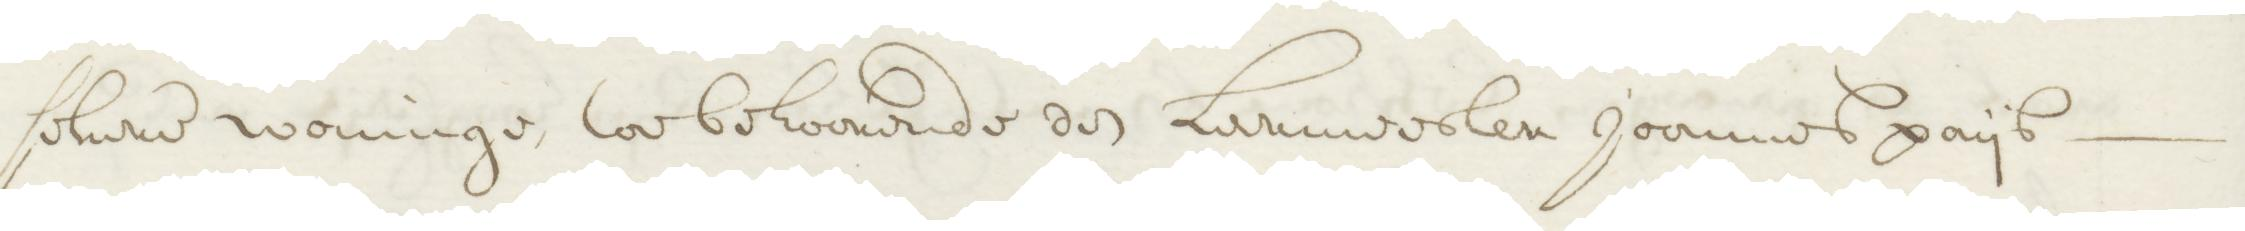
sekere woninge, toebehoorende den leermeester joannes paijs —
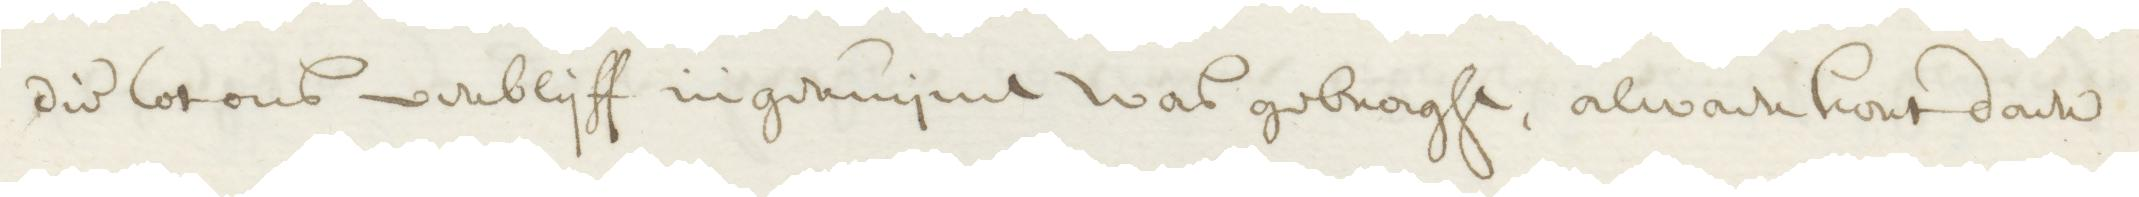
die tot ons verblijff in geruijmt was gebraght, alwaer kort daer
